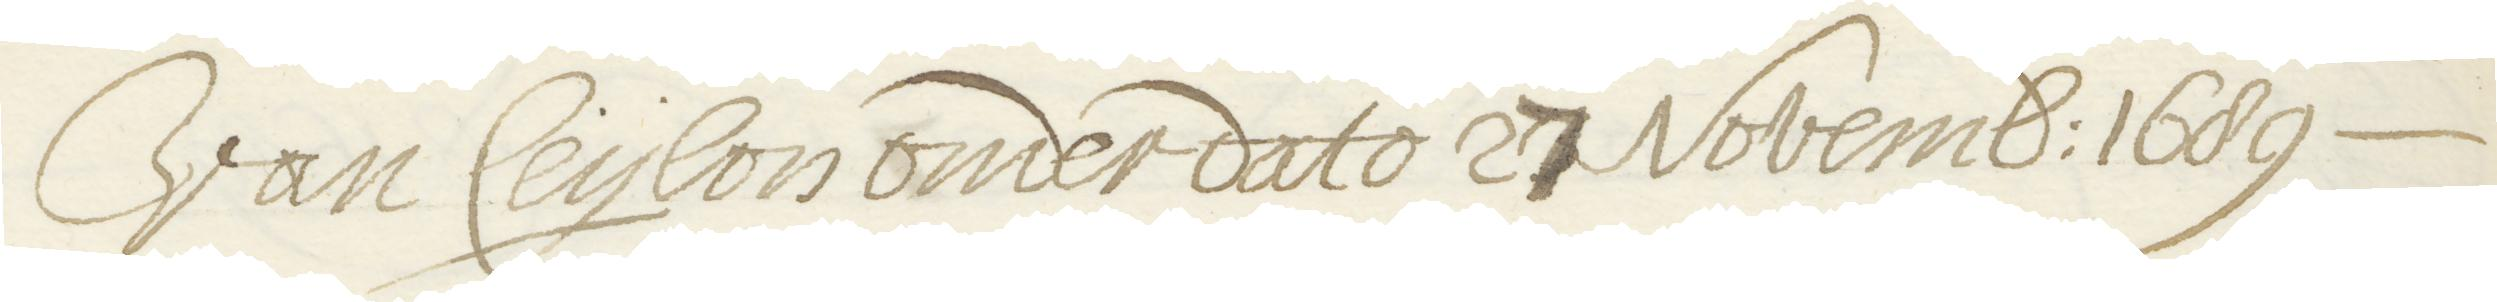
Van Ceijlon onder dato 27' Novemb: 1689 —
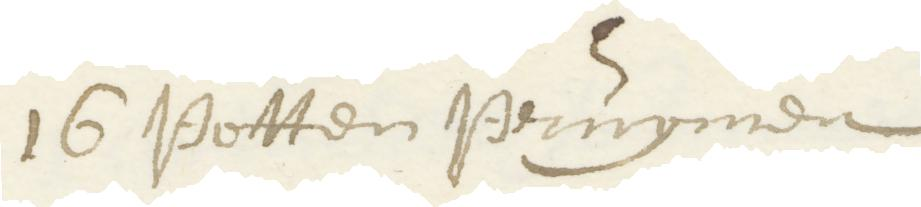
16 potten pruymen
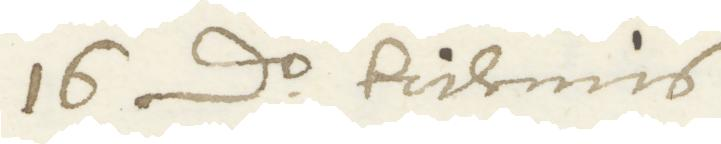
16 d.o kismis
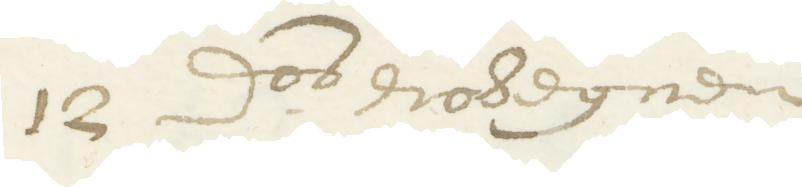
12 d=os roseynen
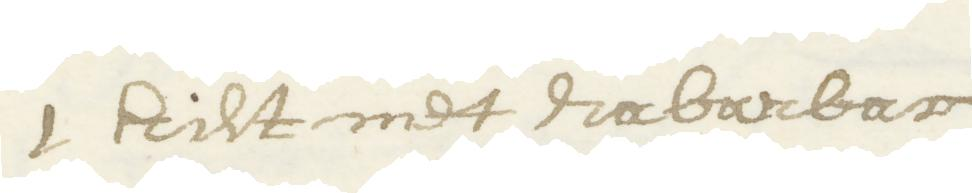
1 kist met rabarbar
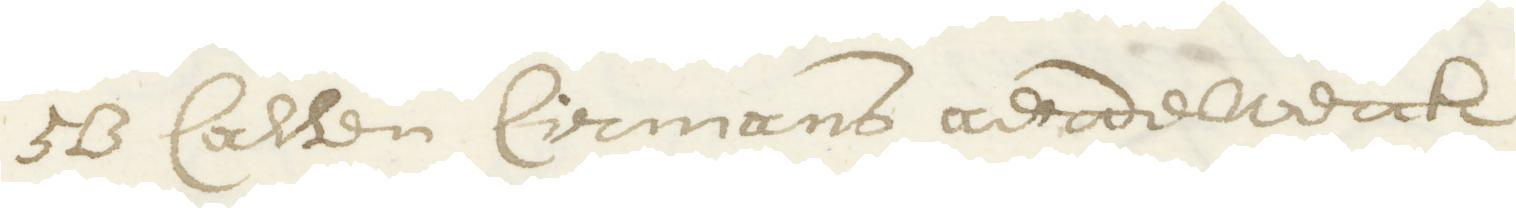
53 Cassen Cirmans aerdewerck
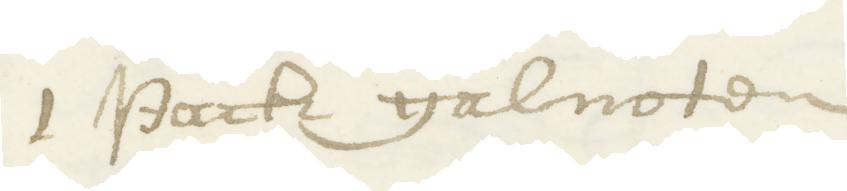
1 pack galnoten
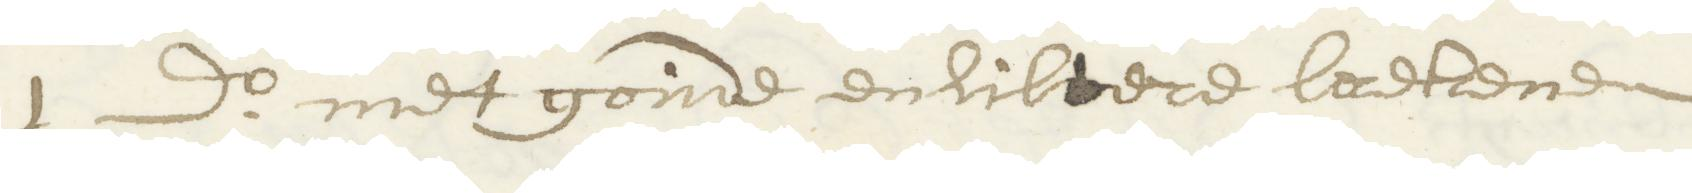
1 d.o met goude en silvere laekenen
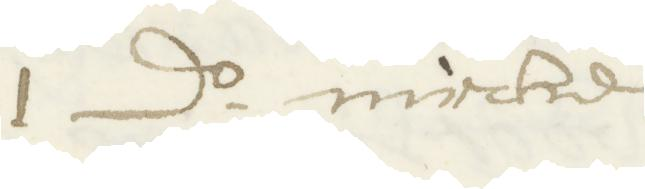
1 d.o mirke
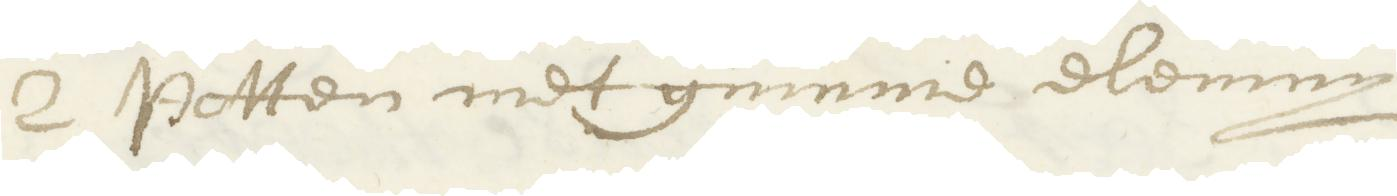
2 potten met gumme elemnij
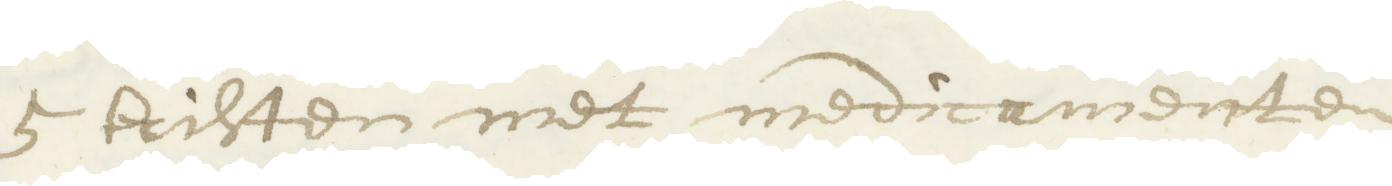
5 kisten met medicamenten
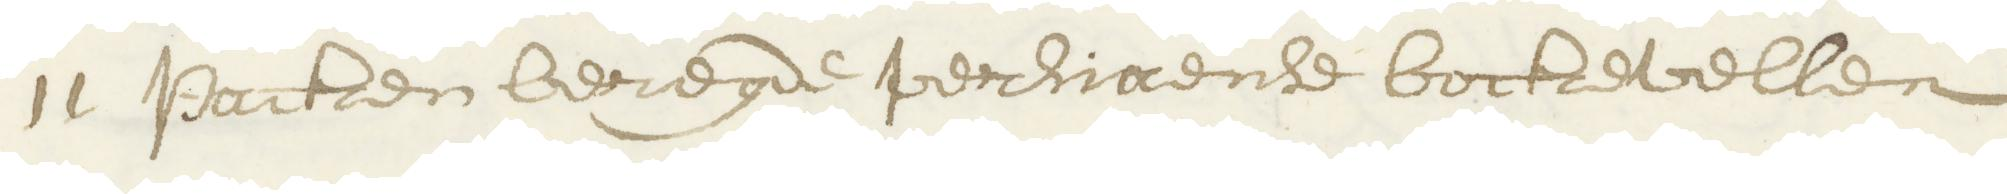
11 packen bereyde persiaense bockevellen
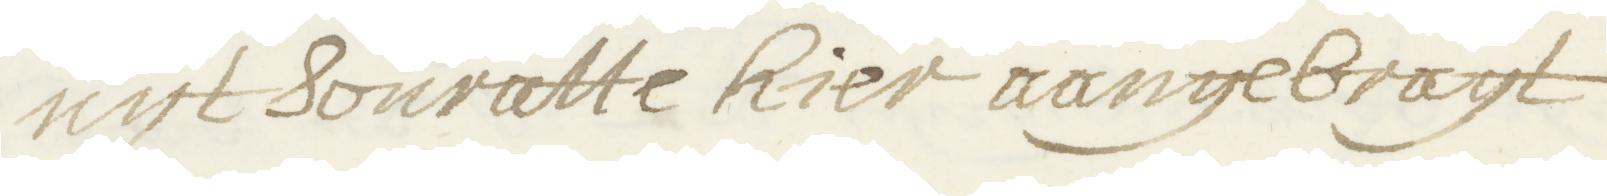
uijt souratte hier aangebragt
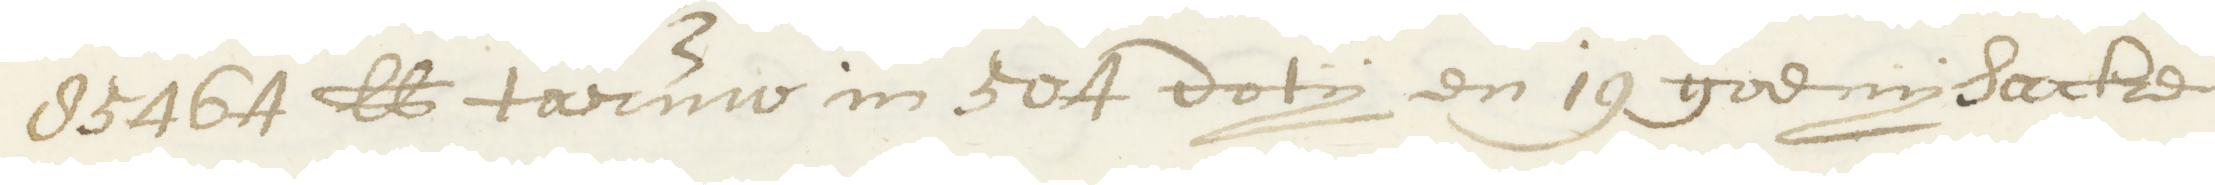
85464 lb taruw in 504 dotij en 19 goenijsacke
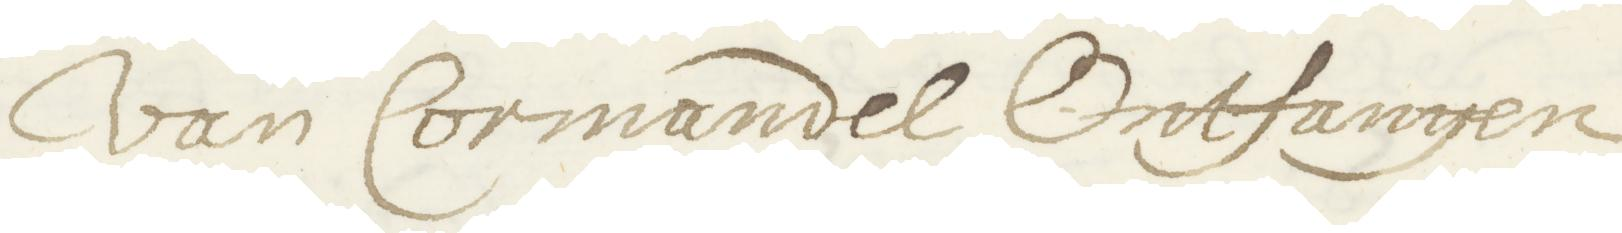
van Cormandel Ontfangen
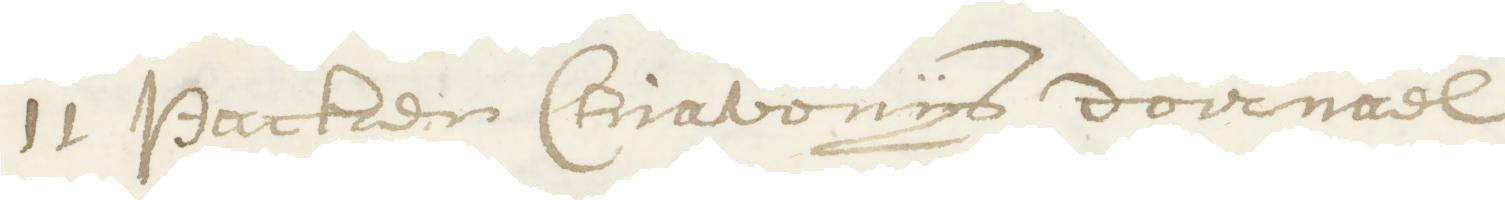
11 packen Chiavonijs doirnael
